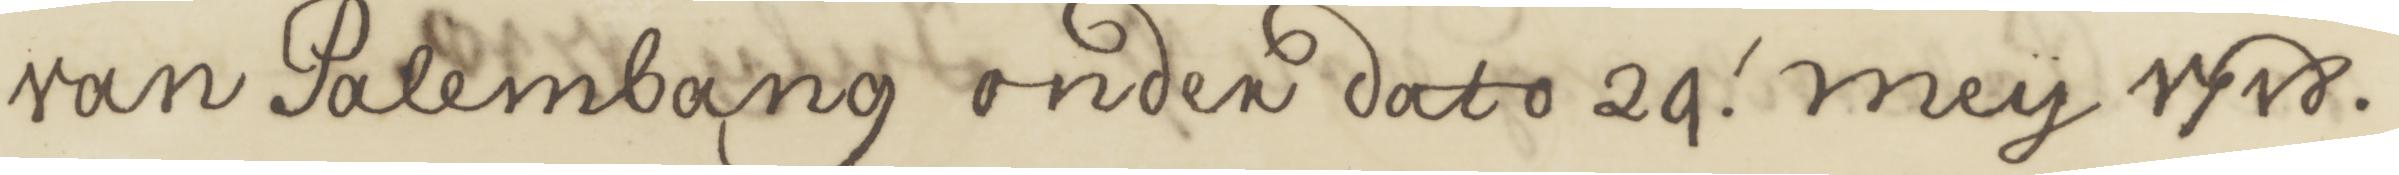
van Palembang onder dato 24.' meij 1718.
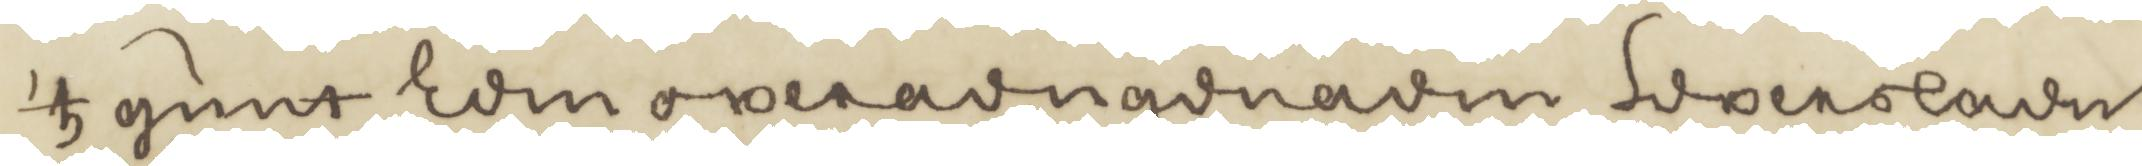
’t gunt hem overaengenaem teverslaen
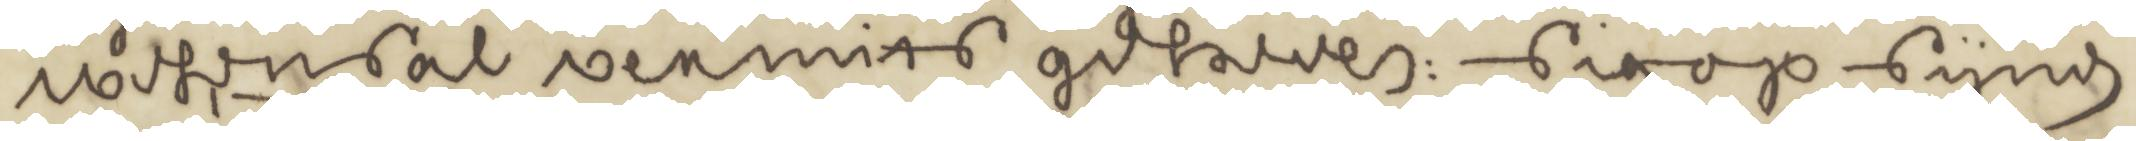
wesens al vermits geheelijk sig op sijnen
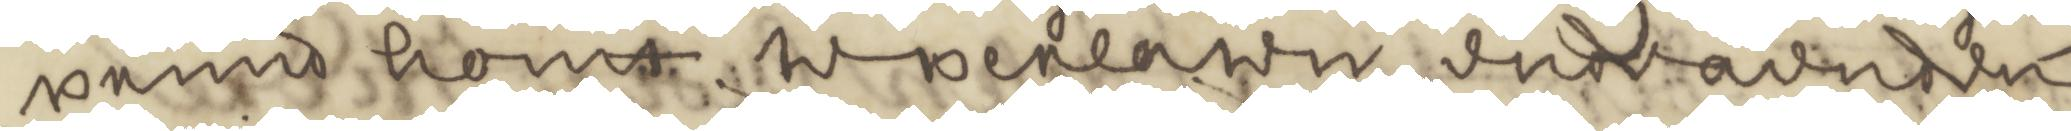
vrund komt te verlaten ende aenden
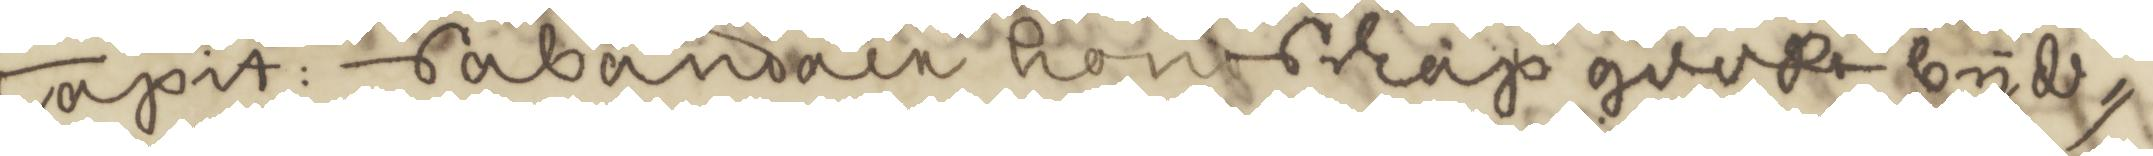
capit: sabandaer kondschap geeft bij de„
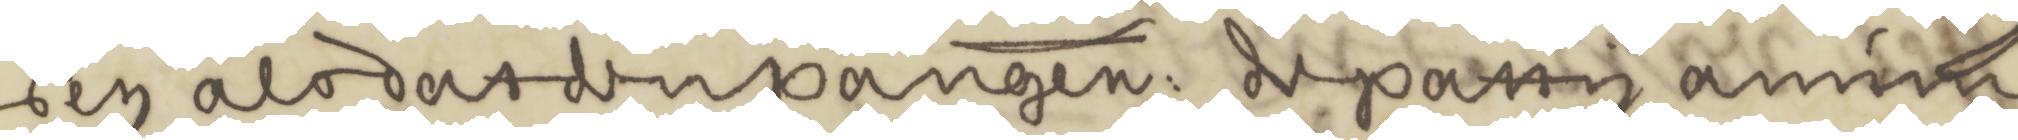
sen als dat den panger: depattij anum
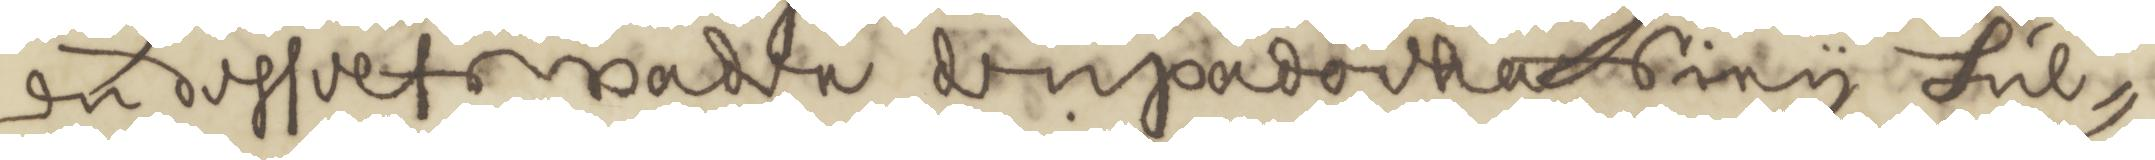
en desselfs vader den padoeka sirij sul„
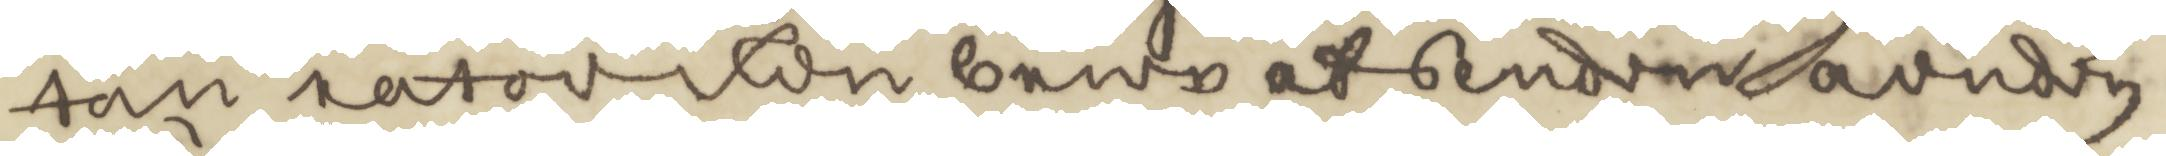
tan ratoe Een briev afsenden aenden
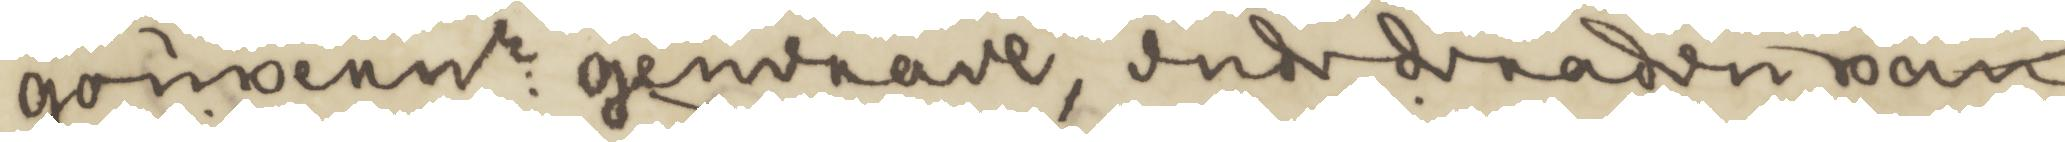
gouvern:r generael, ende de raden van
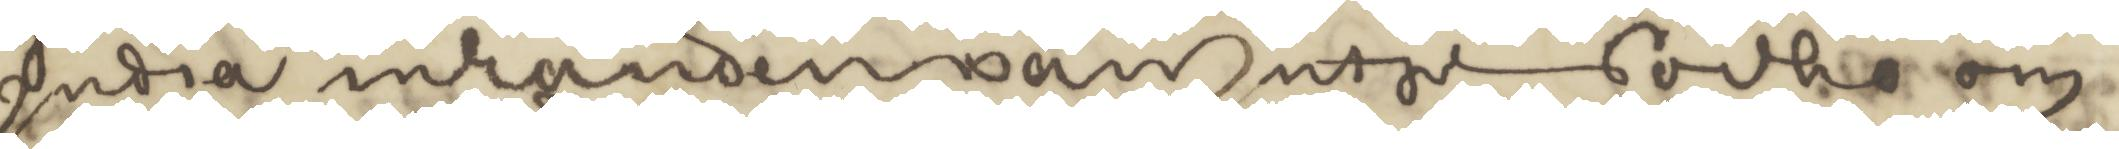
jndia inhanden van Jntje soeke om
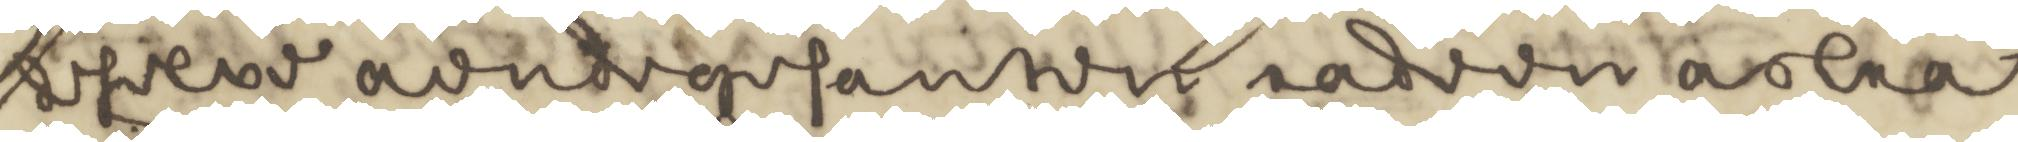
deselve aen de gesanten radeen astra
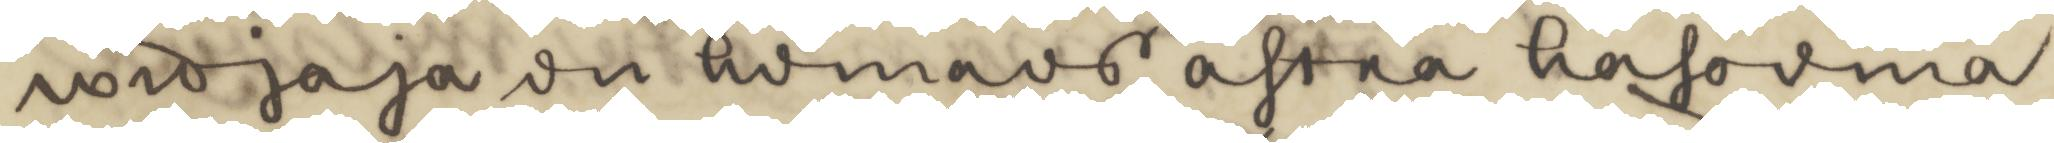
widjaja en kemaes astra kasoema
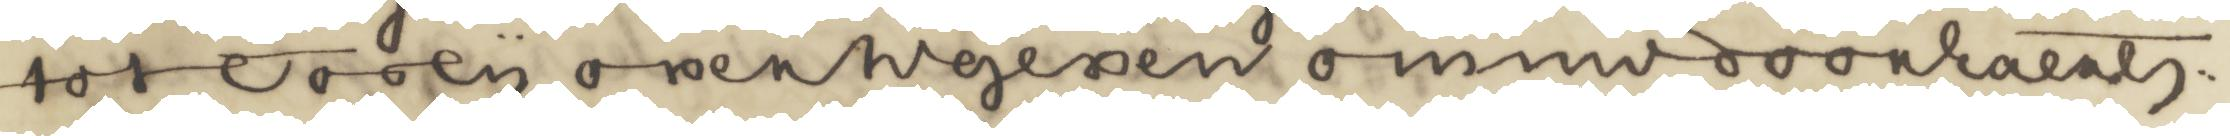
tot Coslij over te geven omme doorhaerlijk
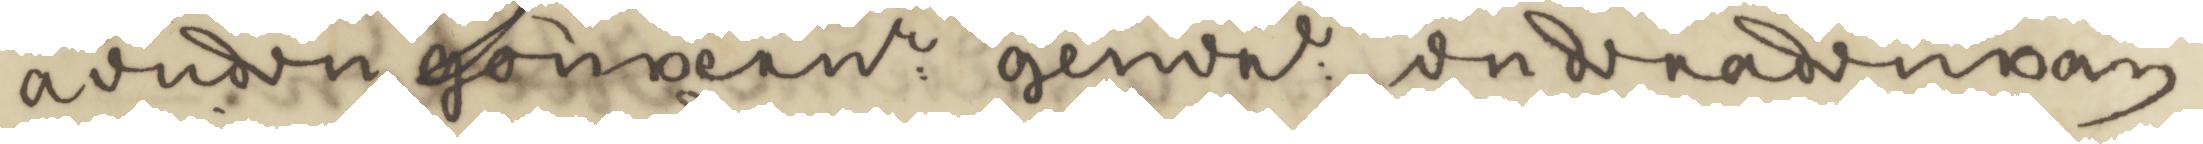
aenden gouvern:r gener:l en de raden van
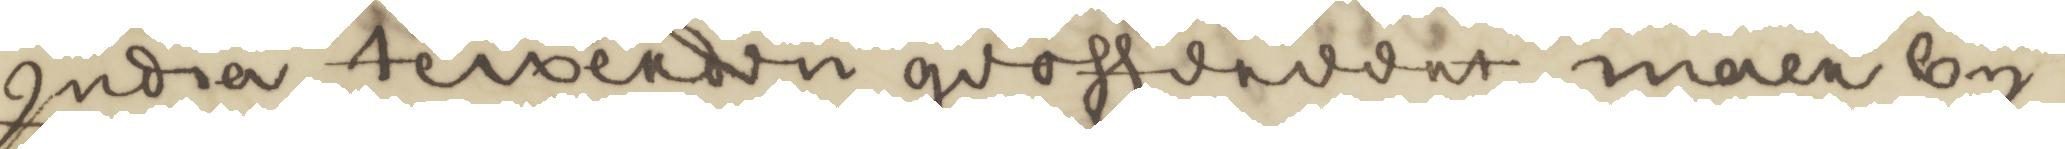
jndia tewerden geoffereert maer bij
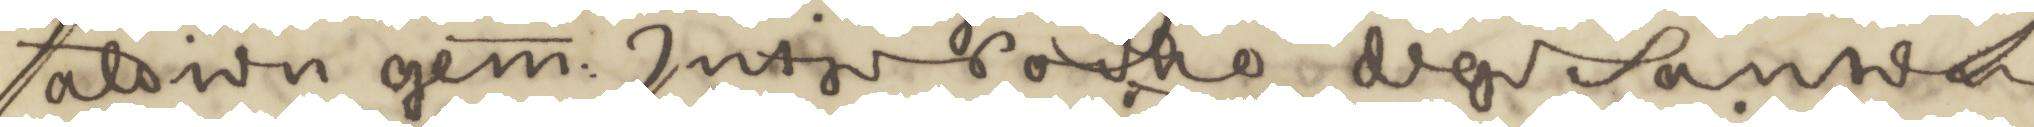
aldien gem: Intje soeko de gesanten
